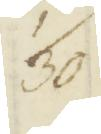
1/30
